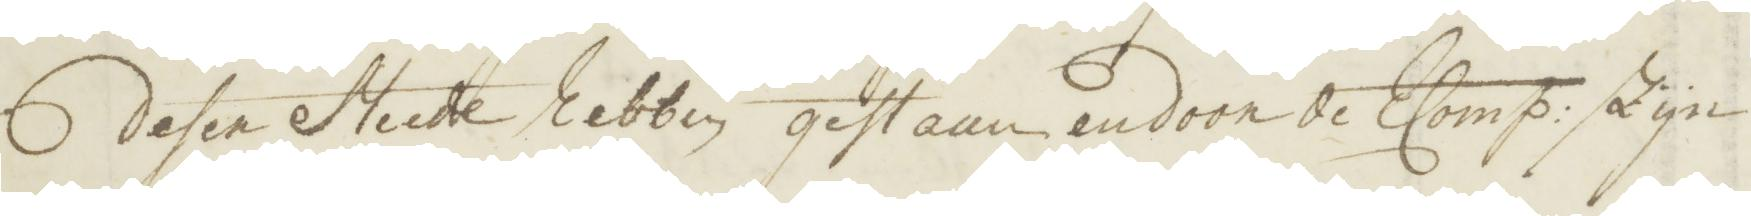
deser steede hebben gestaan en door de EComp: zijn
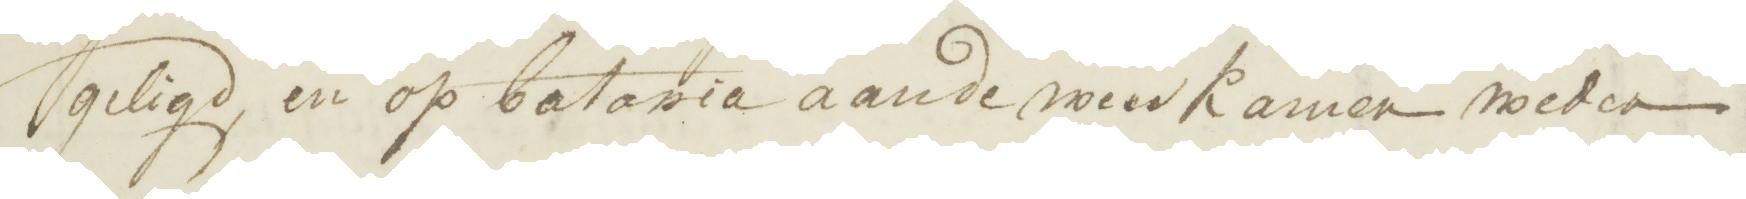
geligd, en op batavia aan de weeskamer weder
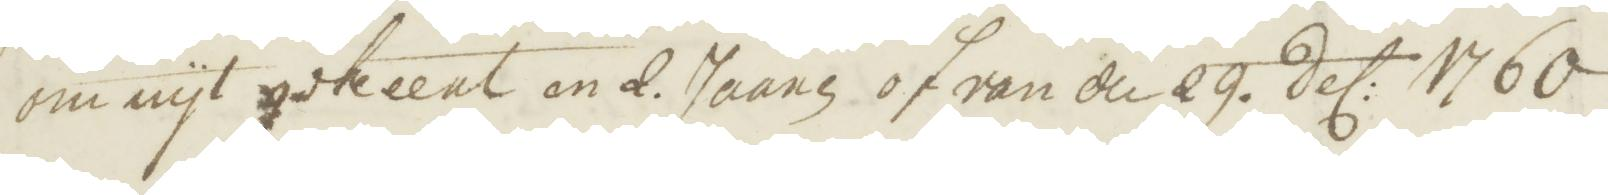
om uijt gekeert en 2. Jaaren of van den 29. dec: 1760
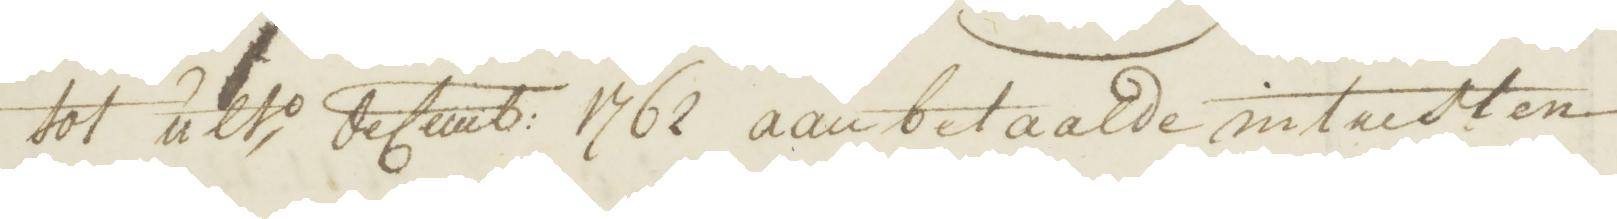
tot ult,o decemb: 1762 aan betaalde intresten
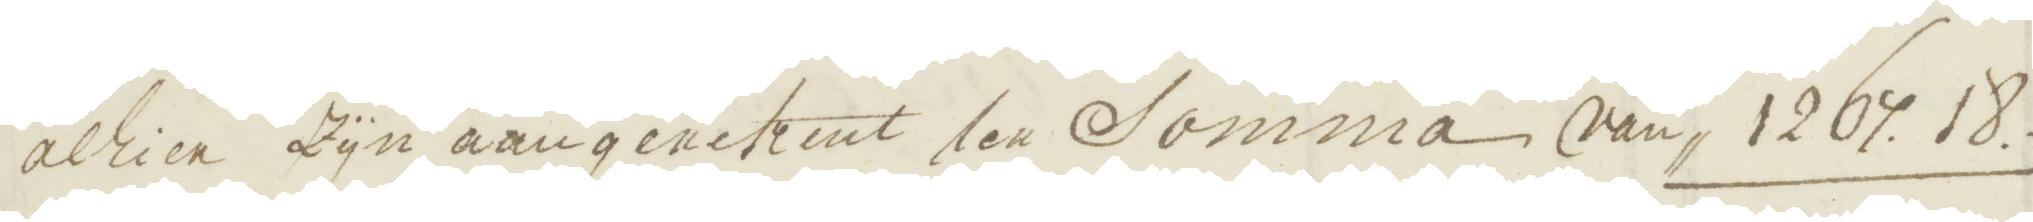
alhier zijn aangerekent ter Somma van„ 1267. 18.
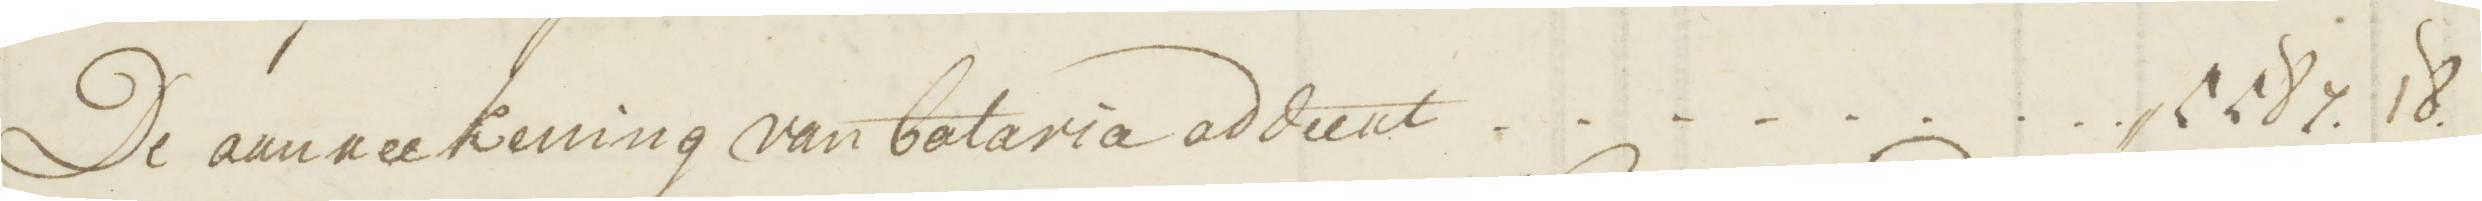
De aanreekening van batavia addeert - - - - - - . . . „5587. 18.
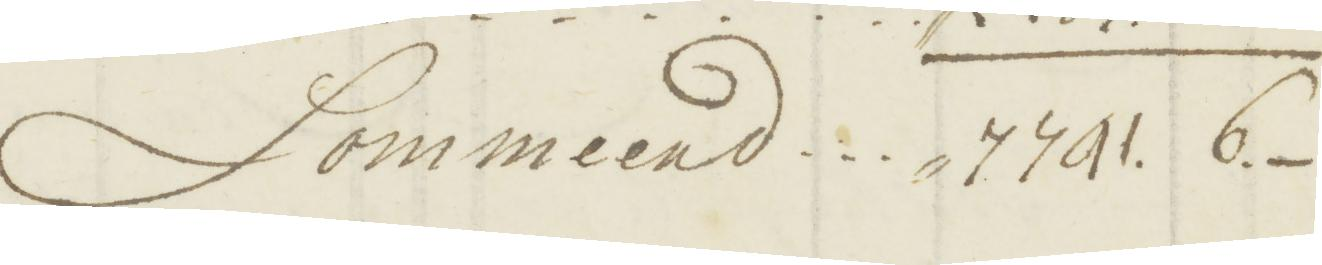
Sommeerd - - - „7741. 6. —
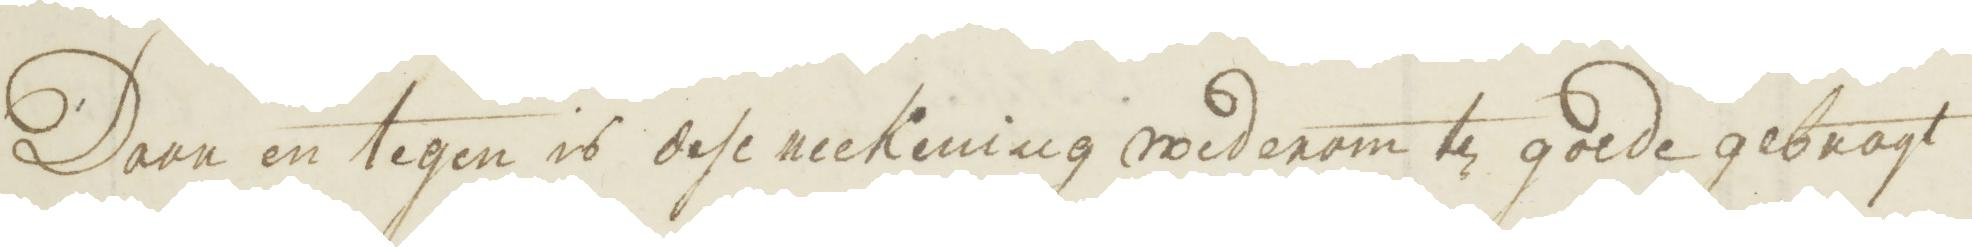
Daar en tegen is dese reekening wederom te goede gebragt
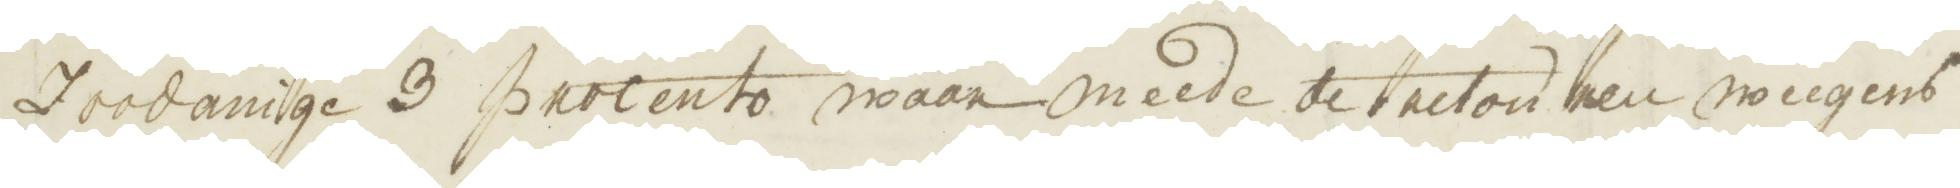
zoodanige 3 procento waar meede de retouren weegens
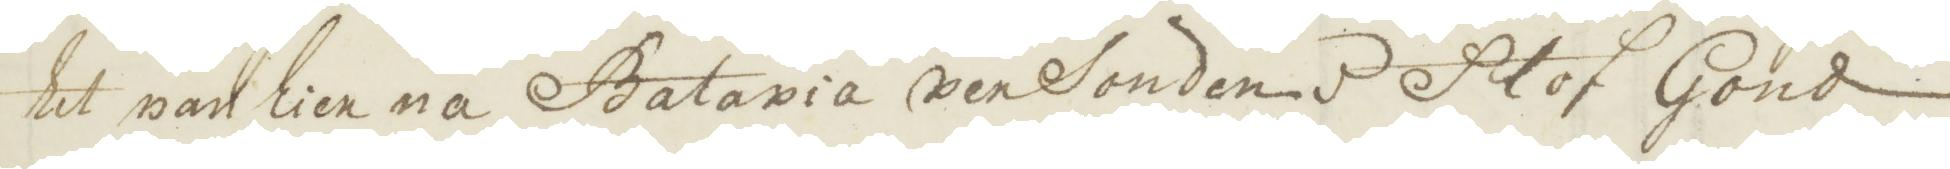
het van hier na Batavia versondene Stof Goud
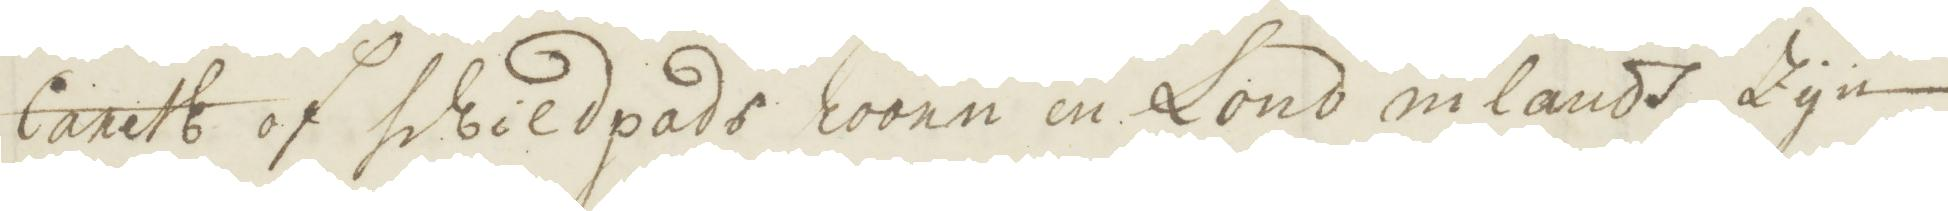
Careth of schildpads hoorn en Lond inlands zijn
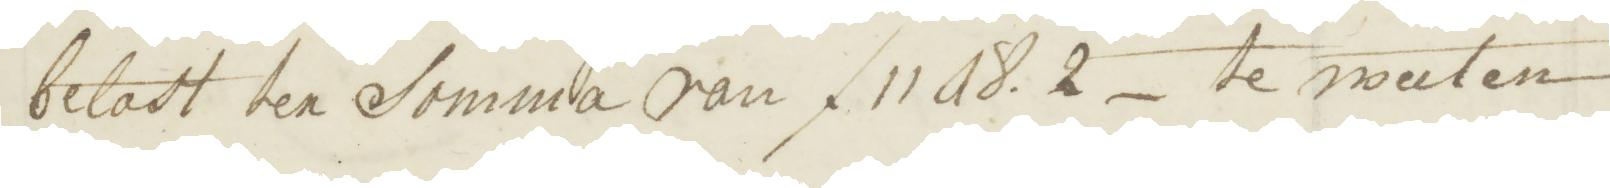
belast ter somma van ƒ1148. 2 — te weeten
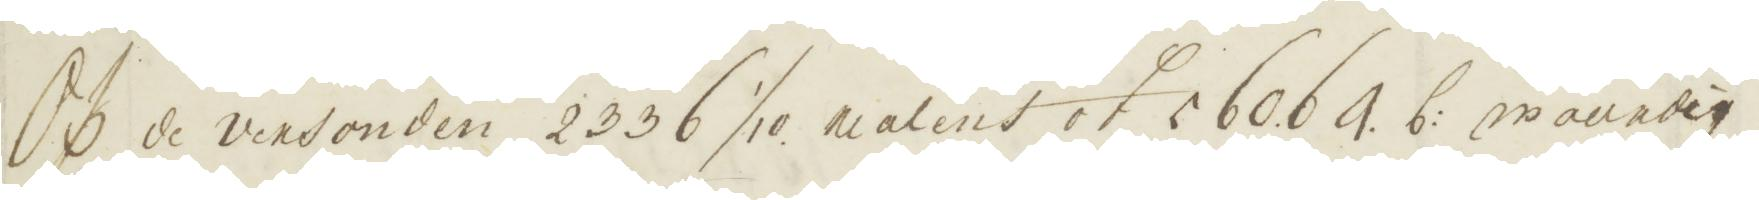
Op de versonden 2336 1/10. valent of 560.64. b: waardig
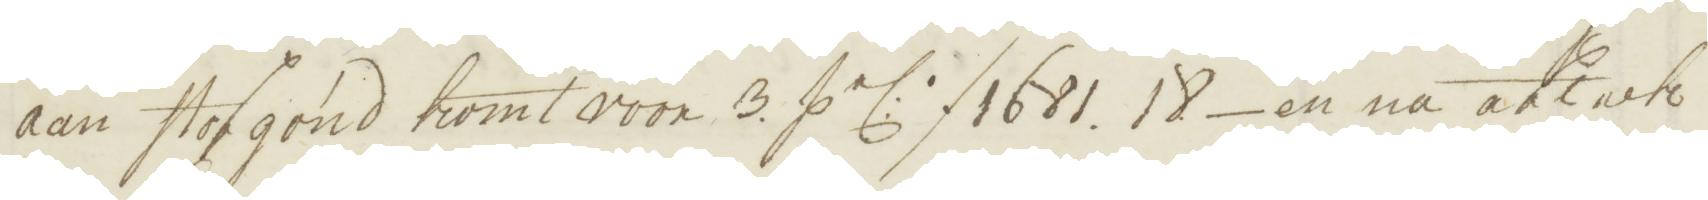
aan stofgoud komt voor 3. prC:' ƒ1681. 18— en na aftrek
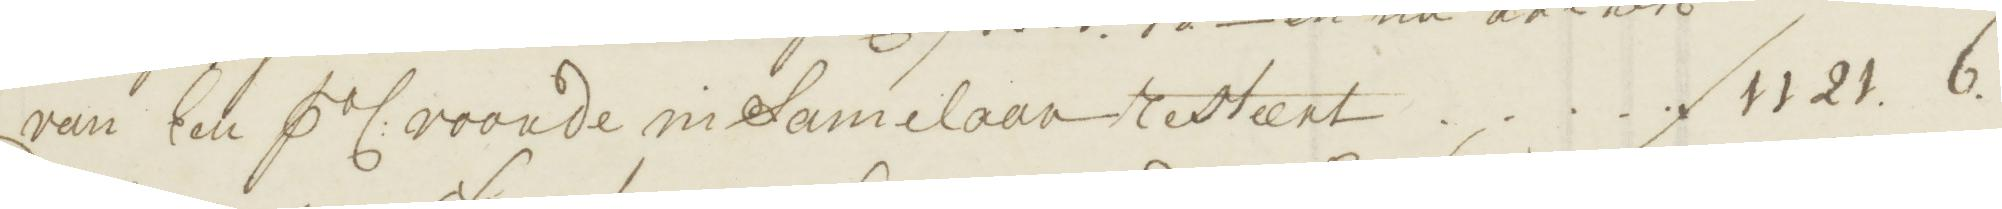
van Een prC: voorde insamelaar resteert . . . . . ƒ1121. 6.
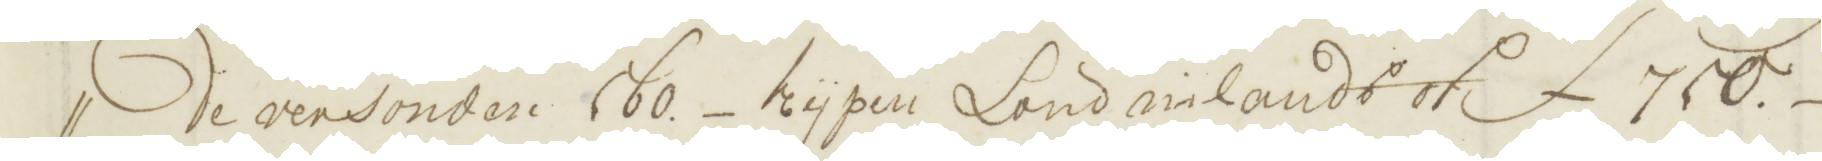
„ de versonden 560. – kijpen Land inlands of ƒ 750. —
